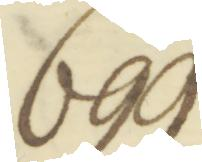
699
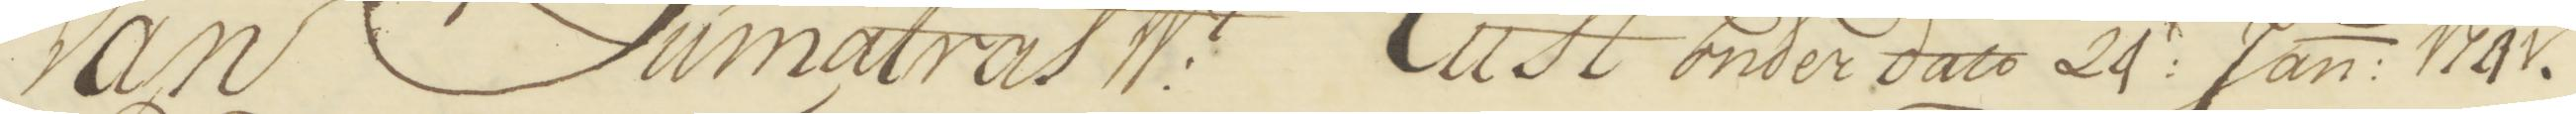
Van Sumatras W:t Cust onder dato 24:' Jan: 1741.
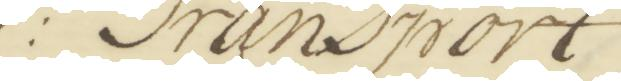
:r Transport
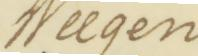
Weegen
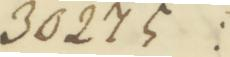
30275 :
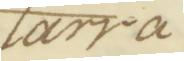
tarra
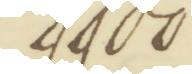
4400
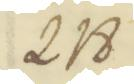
218
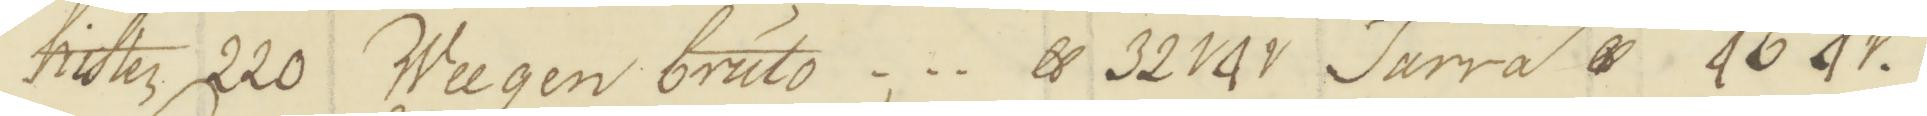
kisten 220 Weegen bruto ... lb 32141 Tarra lb 4641.
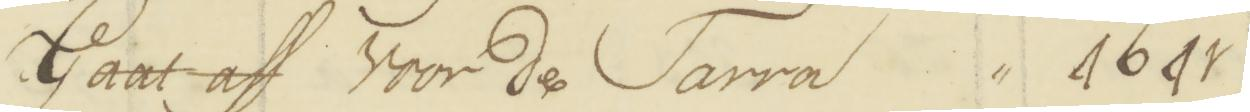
Gaat aff voor de Tarra „ 4641
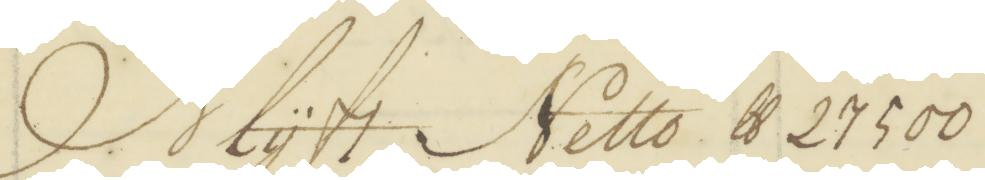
Blijft Netto lb 27500
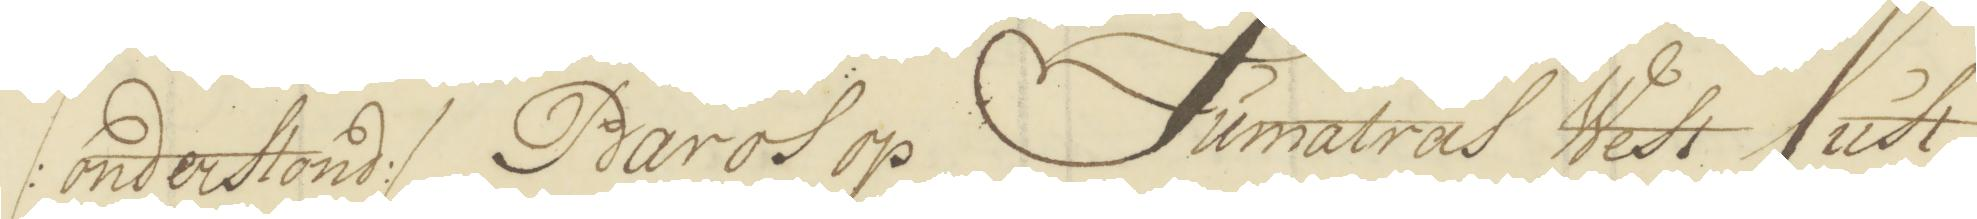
/:onderstond:/ Baros op Sumatras West Cust
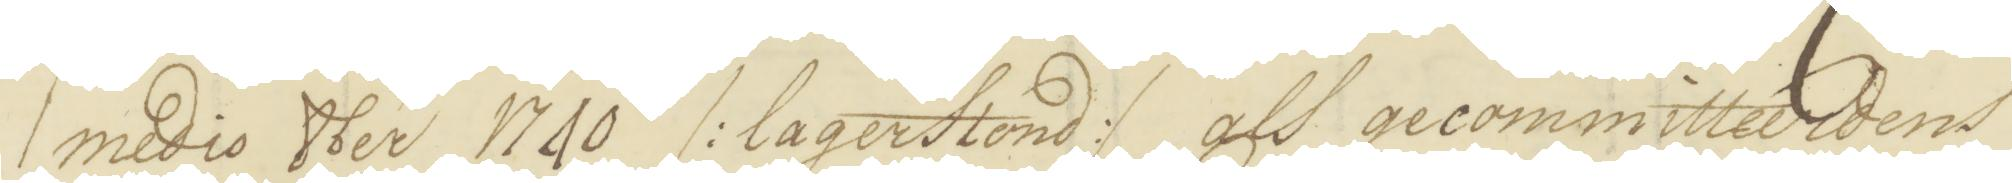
medio 8ber 1740 /:lagerstond:/ als gecommitteerdens
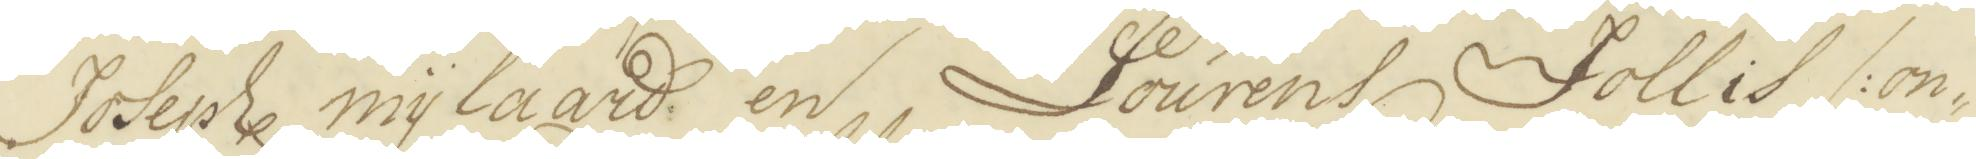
Joseph mijlaard en Lourens Jollis /:on„
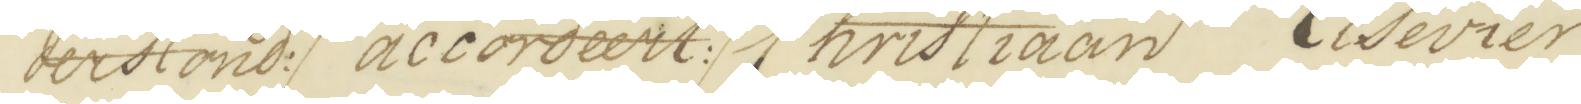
derstond:/ accordeert:/ Christiaan Elsevier
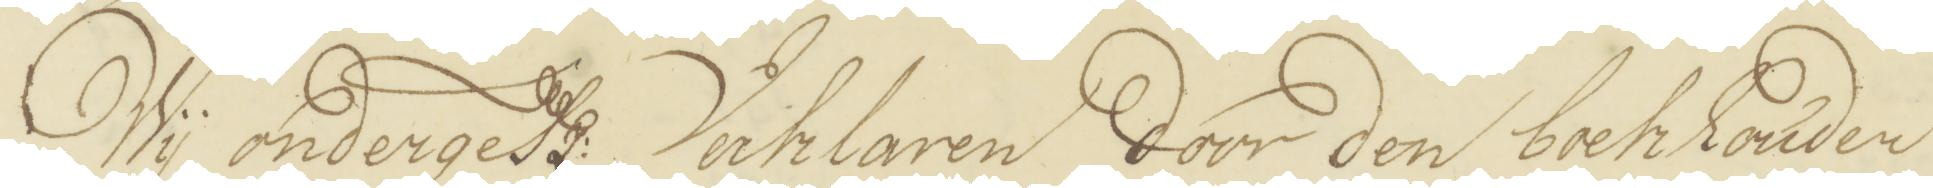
Wij ondergesz: Verklaren door den boekhouder
